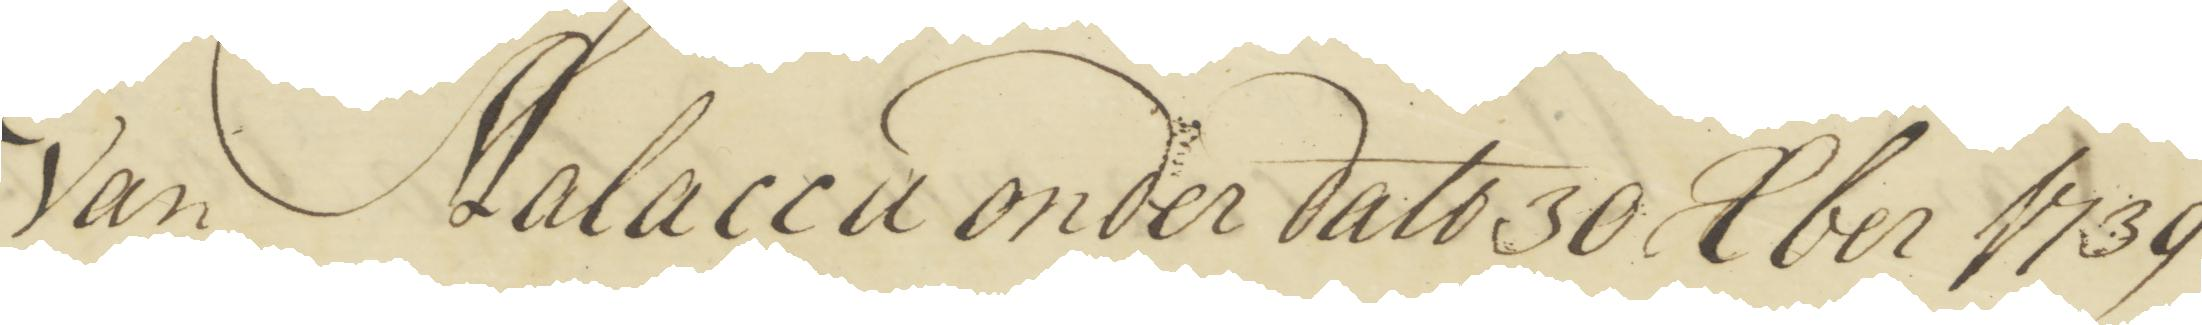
Van Malacca onder dato 30 Xber 1739
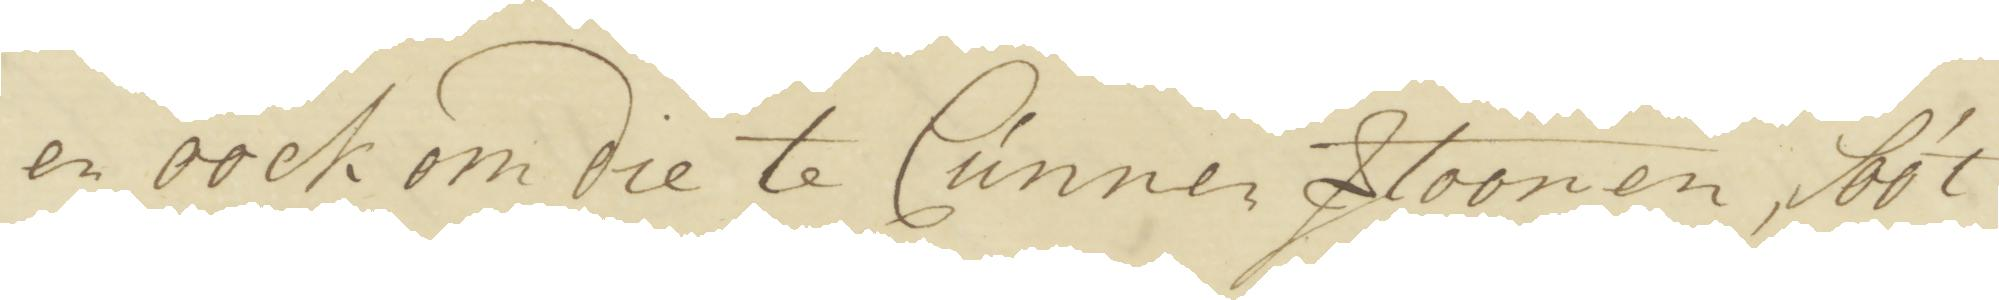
en oock om die te cunnen vertoonen, soo 't
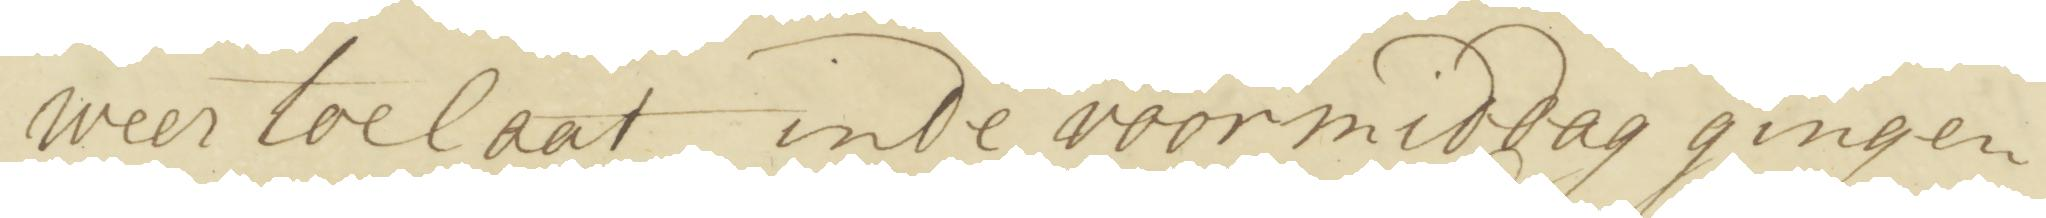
weer toelaat inde voormiddag gingen
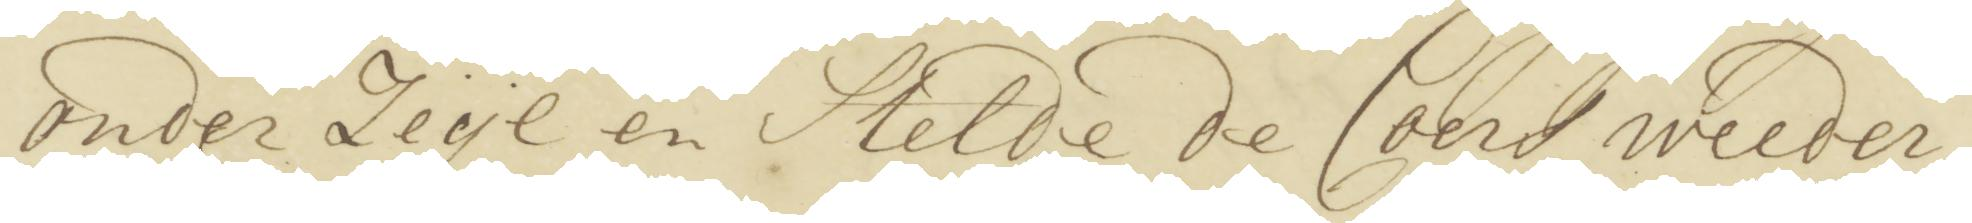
onder zeijl en stelde de coers weeder
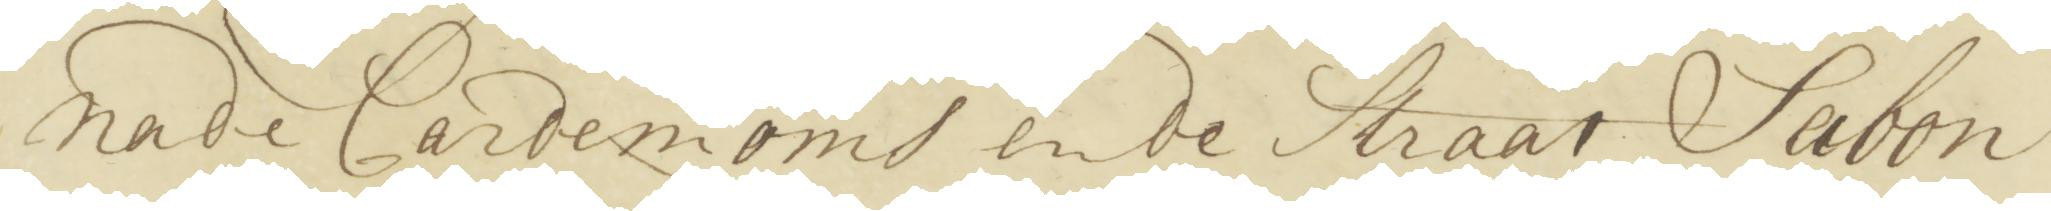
na de Cardemoms en de straat Sabon
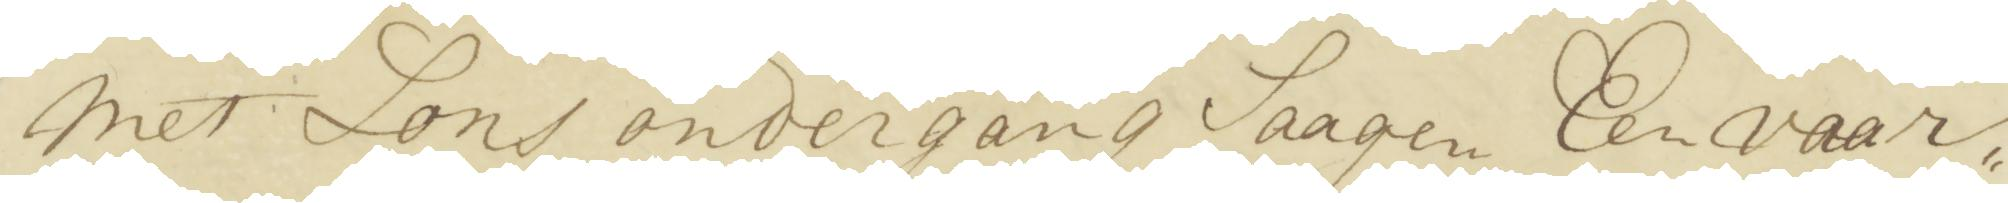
met zons ondergang saagen Een vaar„
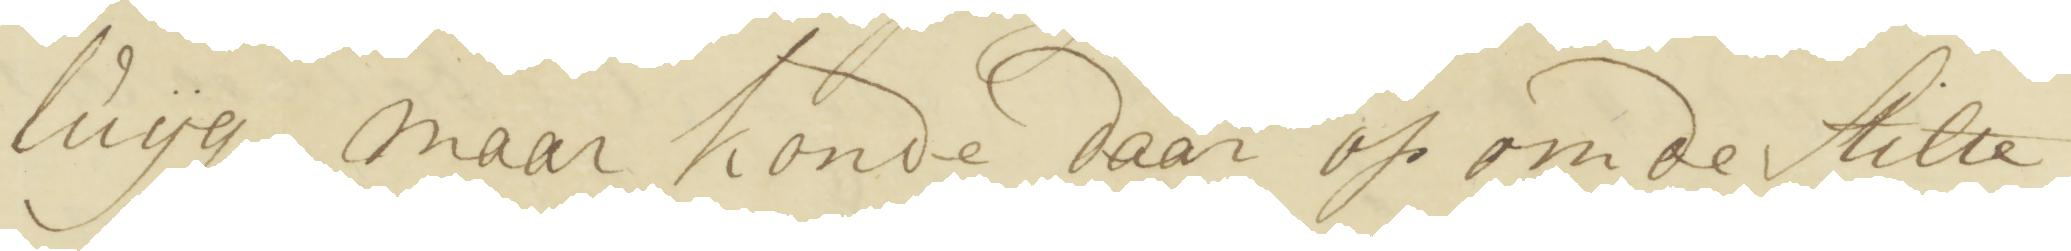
luijg, maar konde daar op om de stilte
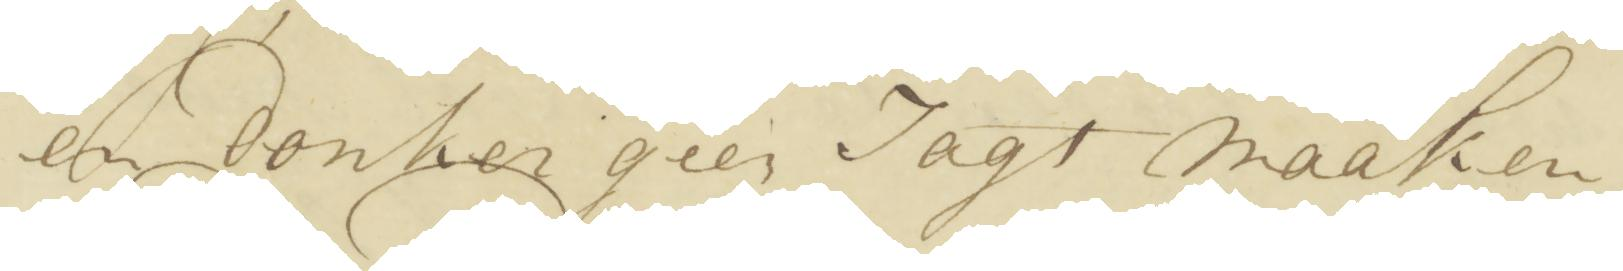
en donker geen Iagt maaken
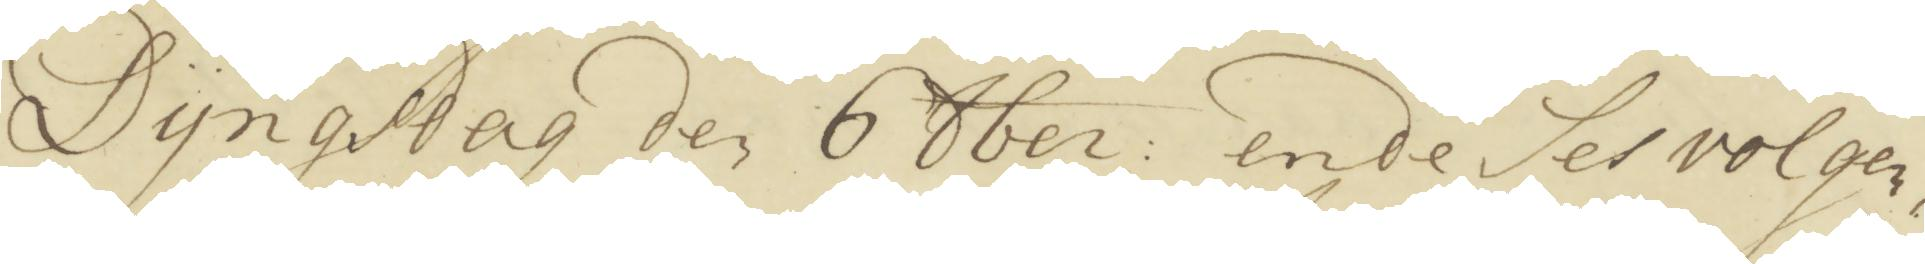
Dijngsdag den 6 8ber: ende ses volgen„
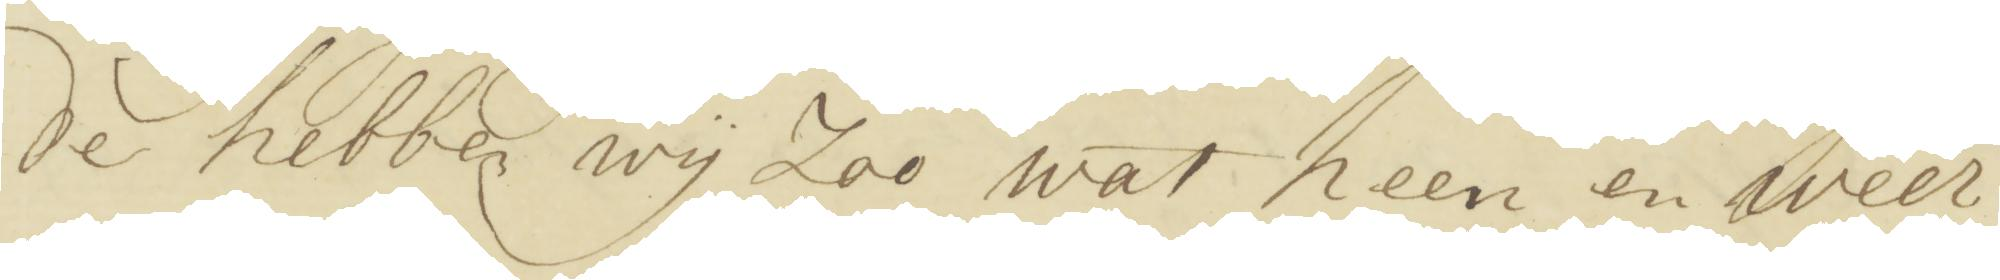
de hebben wij zoo wat heen en weer
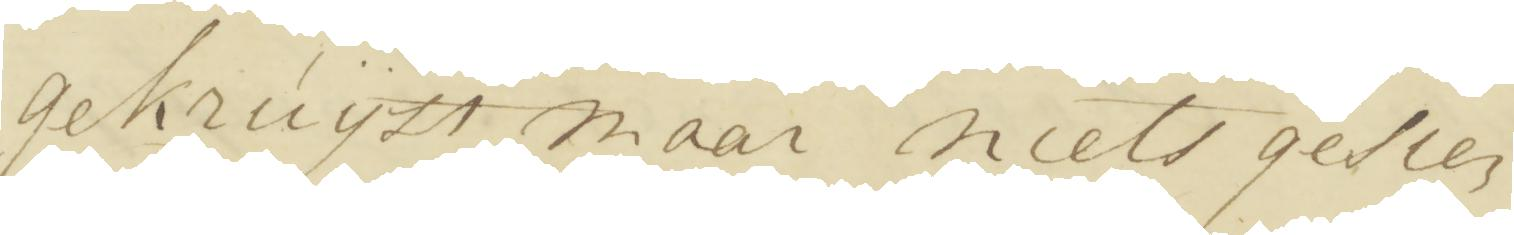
gekruijst maar niets gesien
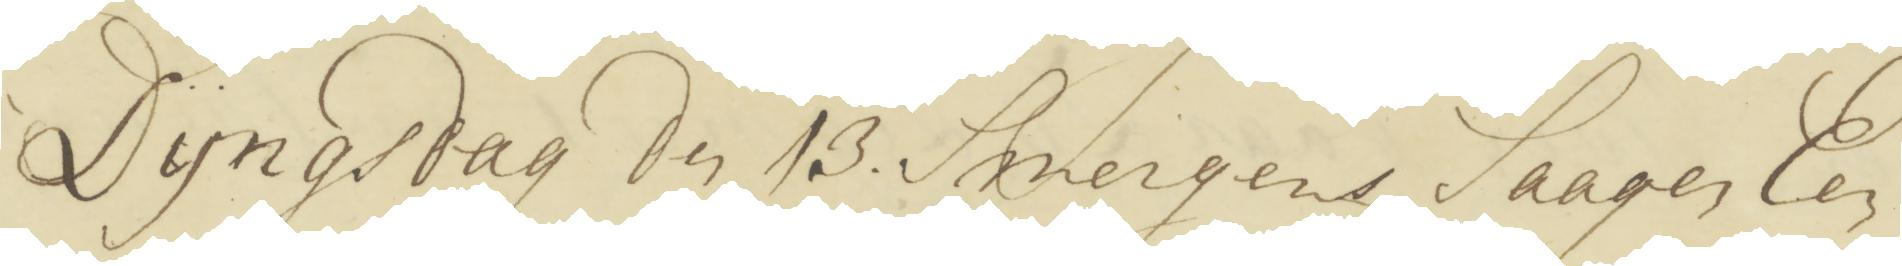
Dijngsdag den 13: smergens saagen Een
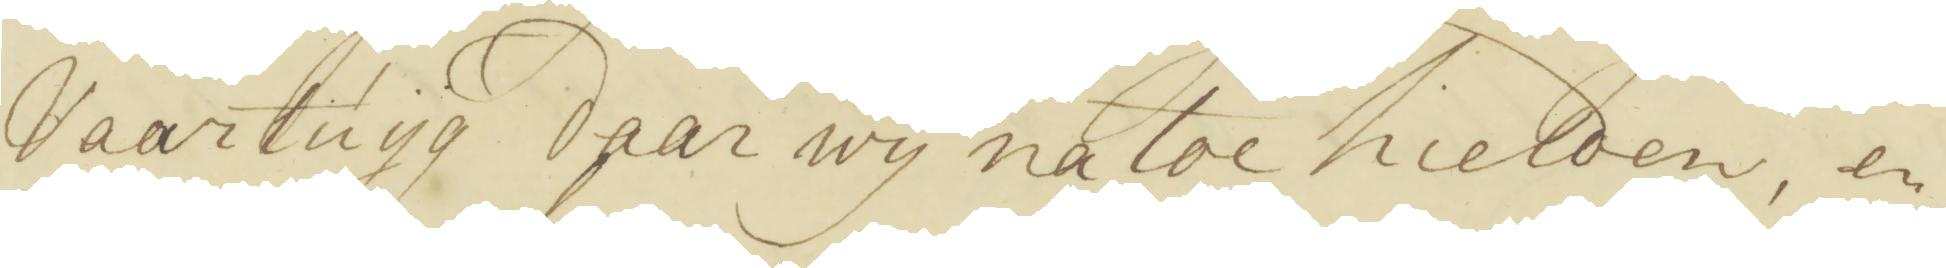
vaartuijg daar wij na toe hielden, en
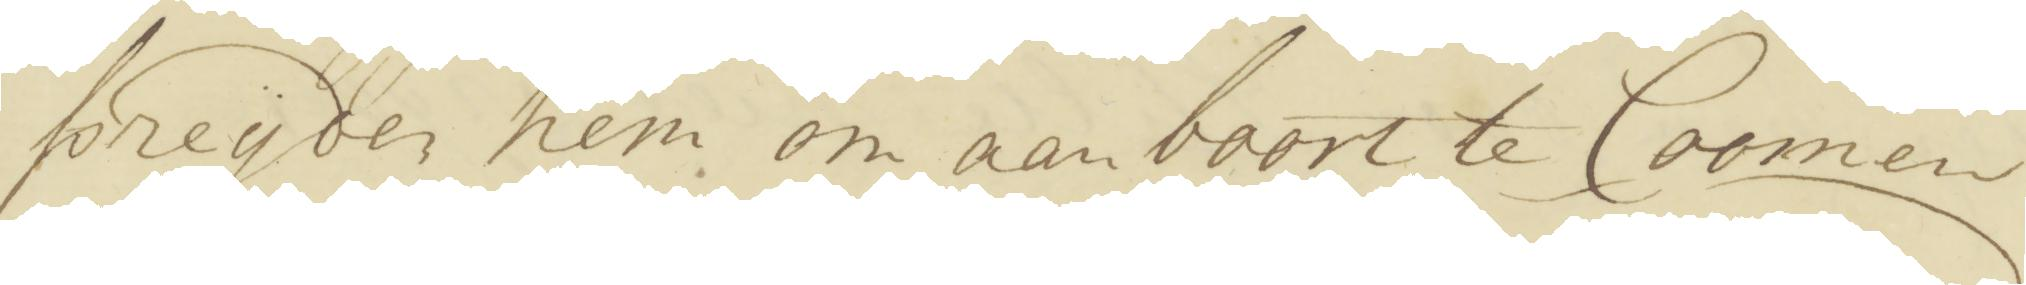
preijden hem om aan boort te coomen
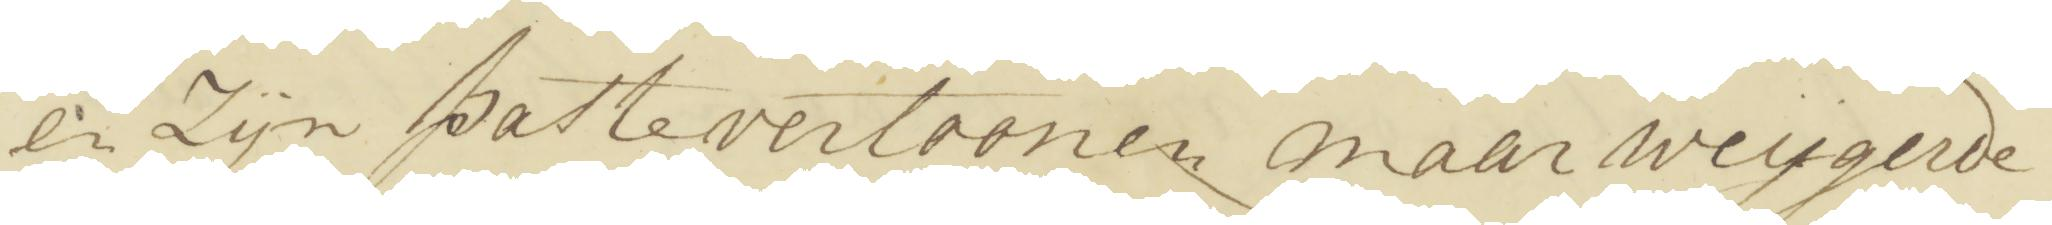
en zijn pas te vertoonen maar weijgerde
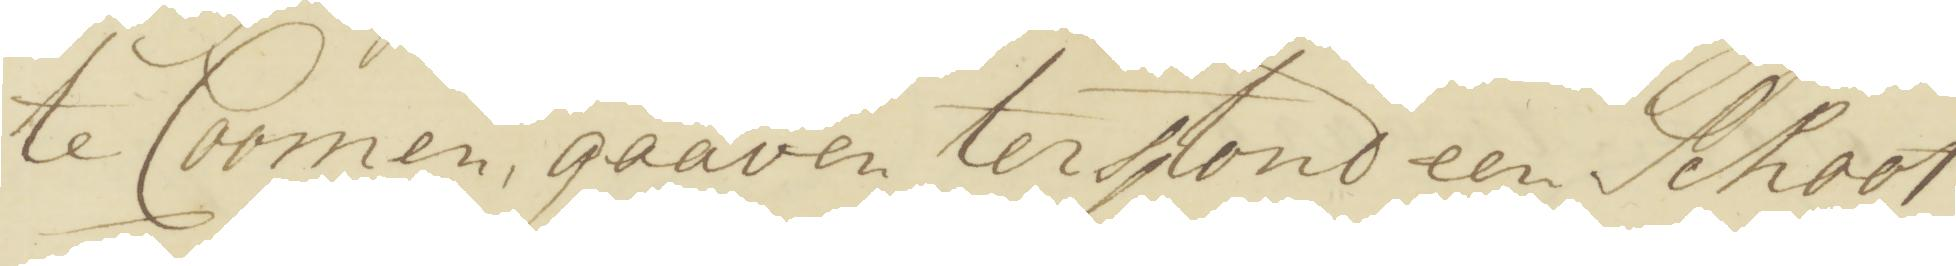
te coomen, gaaven terstond een schoot
